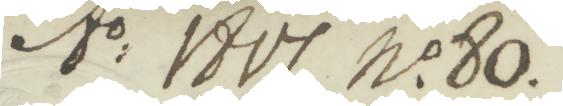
A:o 1817. N.o 80.
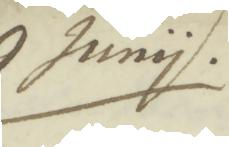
9 Junij.
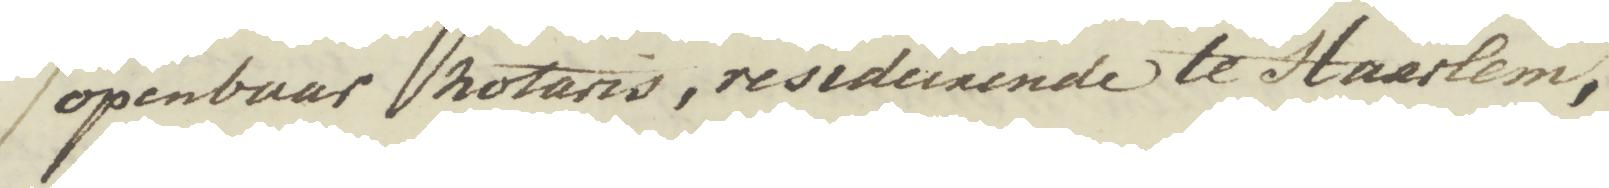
openbaar notaris, resideerende te Haarlem,
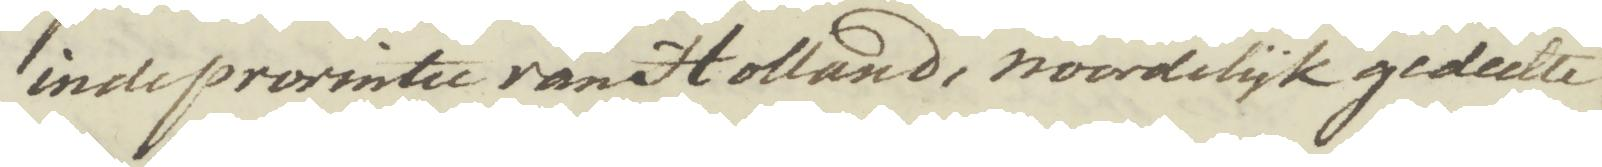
in de provintie van Holland, noordelijk gedeelte
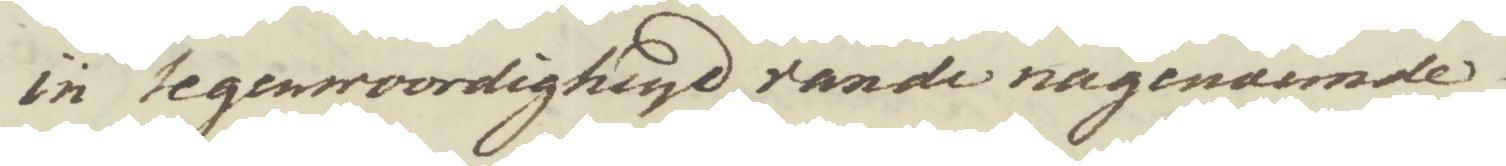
in tegenwoordigheyd vande nagenoemde
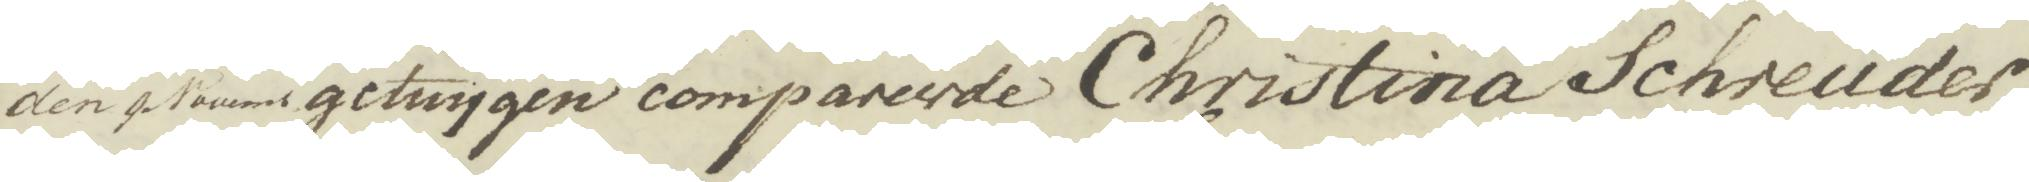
den 9 Novemb getuijgen compareerde Christina Schreuder,
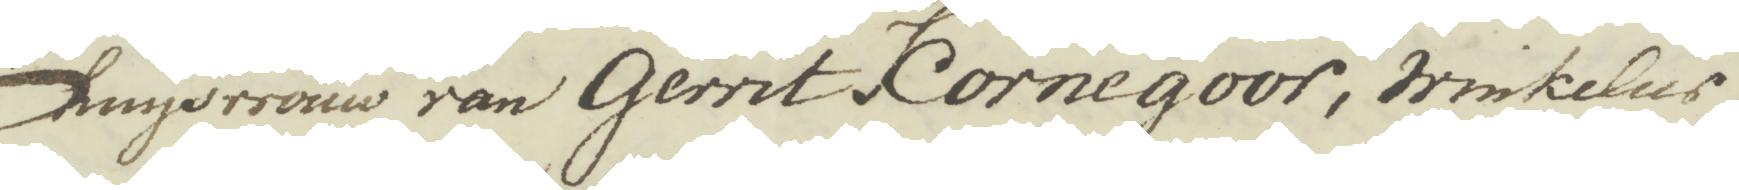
huysvrouw van Gerrit Kornegoor, winkelier,
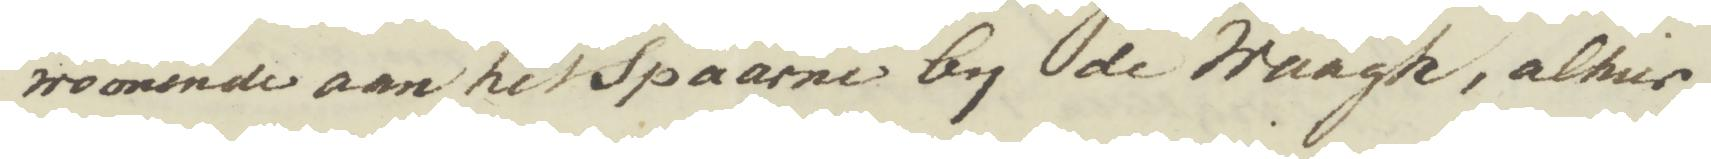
woonende aan het Spaarne by de Waagh, alhier
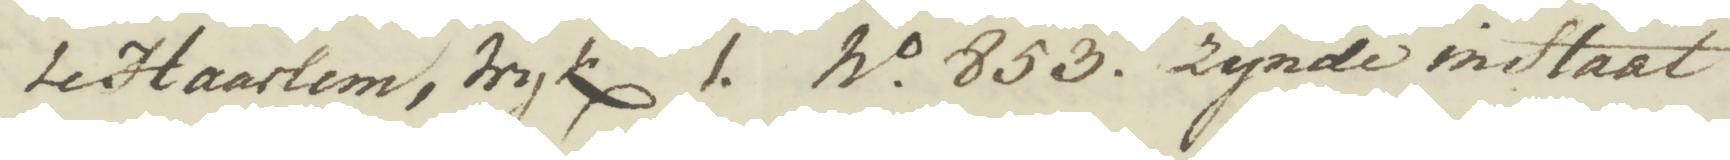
te Haarlem, wyk 1. n.o 853. zynde in staat
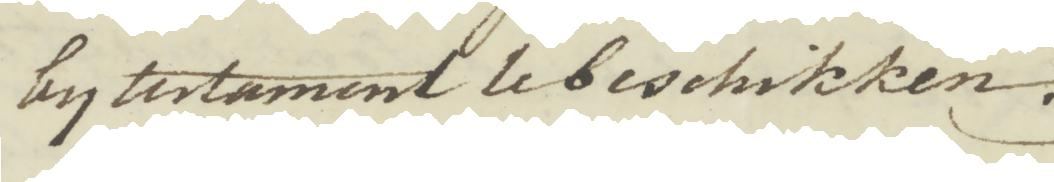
bij testament te beschikken.
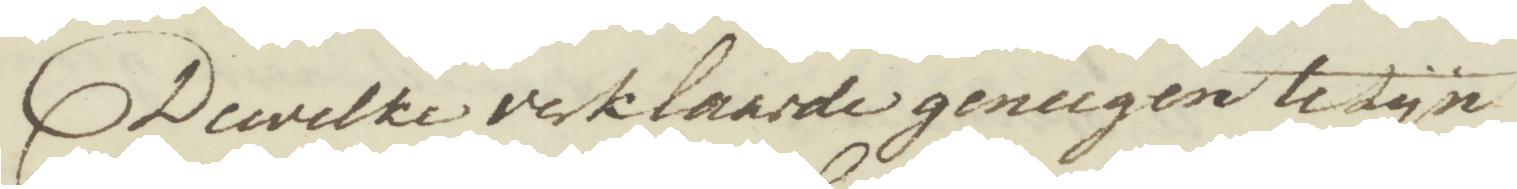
Dewelke verklaarde geneegen te zijn
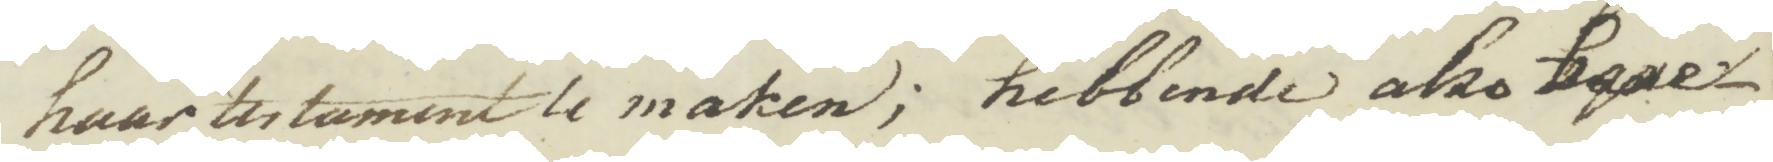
haar testament te maken; hebbende alzo harer
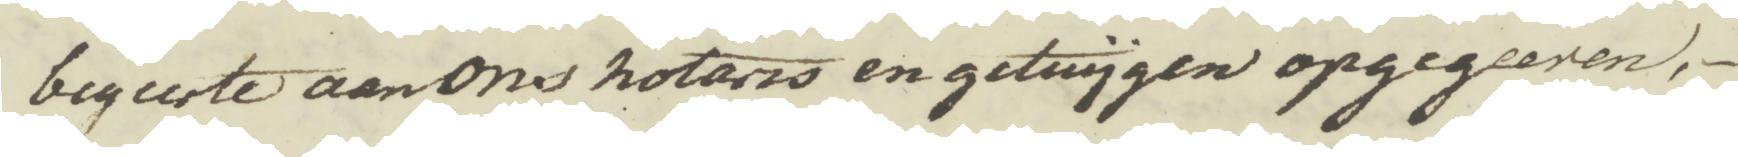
begeerte aan ons notaris en getuijgen opgegeeven,-
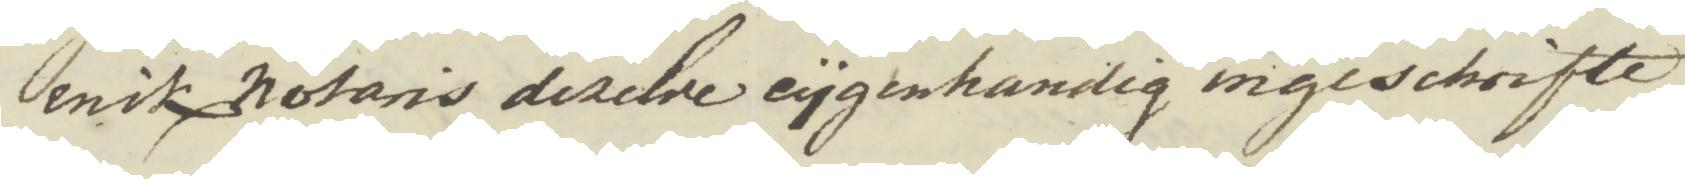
en ik notaris dezelve eijgenhandig ingeschrifte
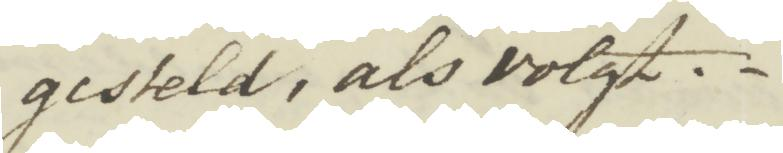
gesteld, als volgt. -
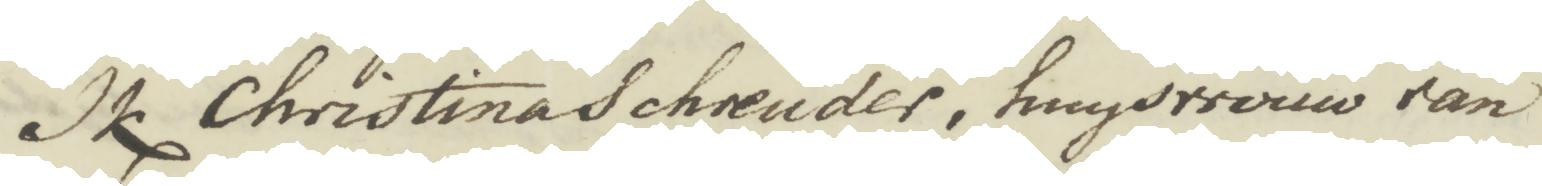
Ik Christina Schreuder, huysvrouw van
